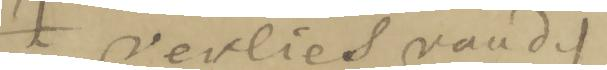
’t verlies van den
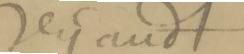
vijandt
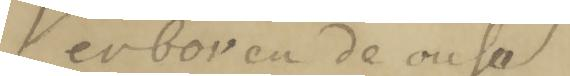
Verboven de onsa
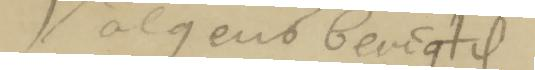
Volgens berigten
